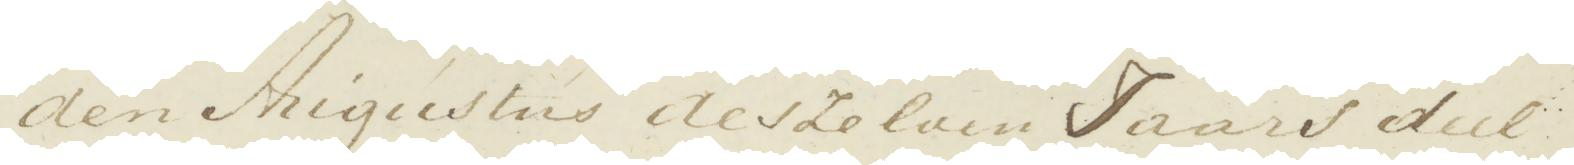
=den Augustus deszelven Jaars deel
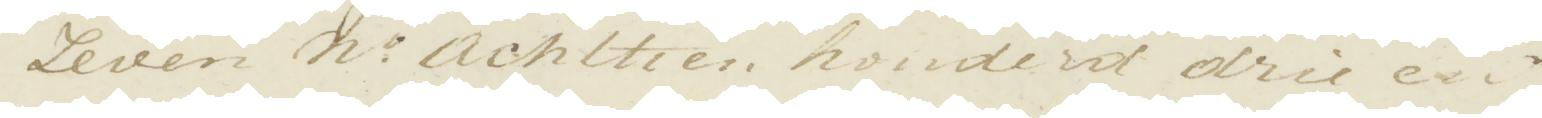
Zeven n:o achttien honderd drie en
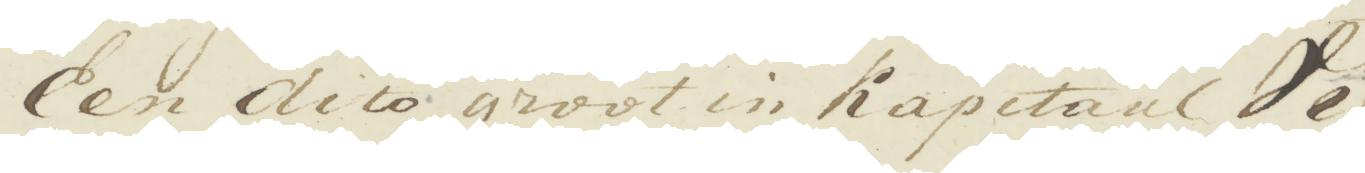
Een dito groot in Kapitaal Vijf
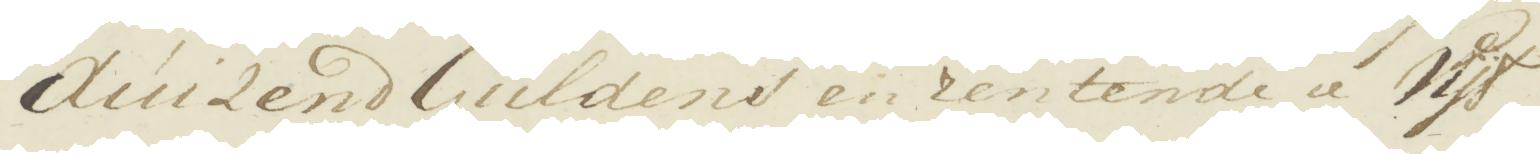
duizend Guldens en rentende a Vijf
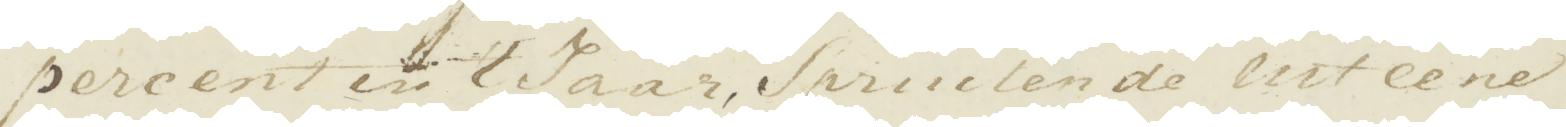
percent in ’t Jaar, spruitende uit eene
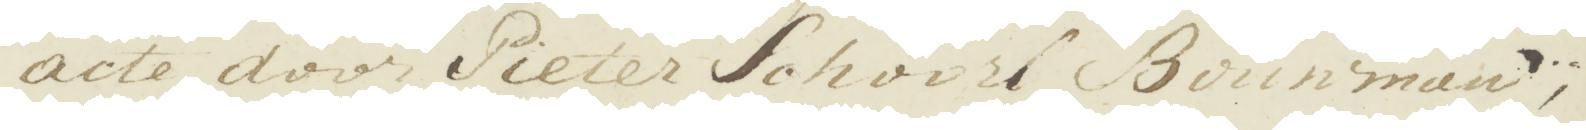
acte door Pieter Schoorl, Bouwman,
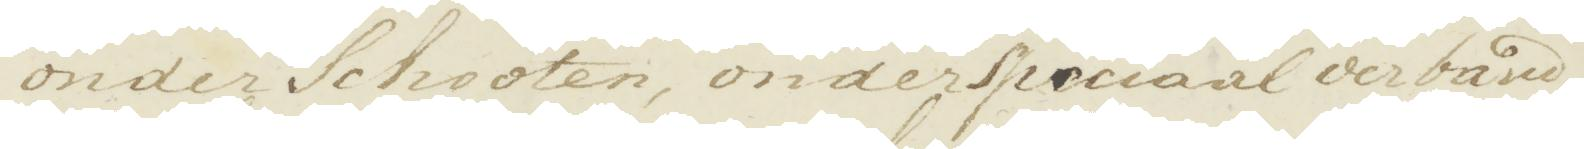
onder Schooten, onder speciaal verband
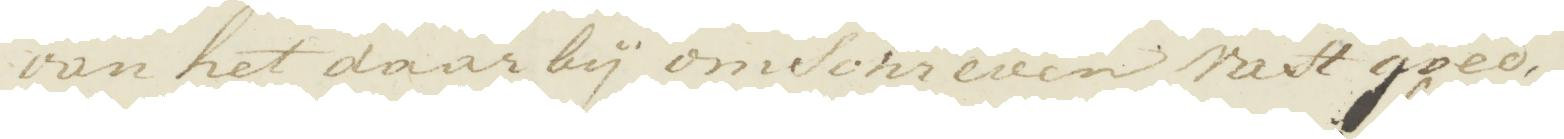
van het daar bij omschreven vast goed,
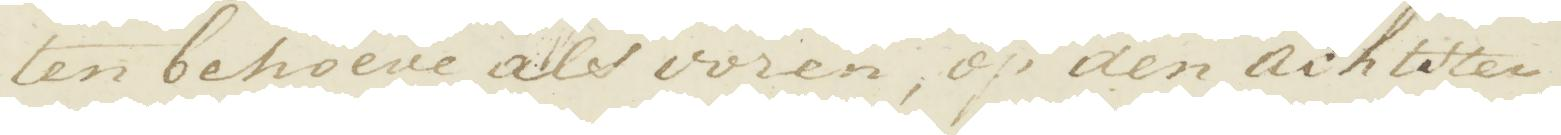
ten behoeve als voren, op den achtsten
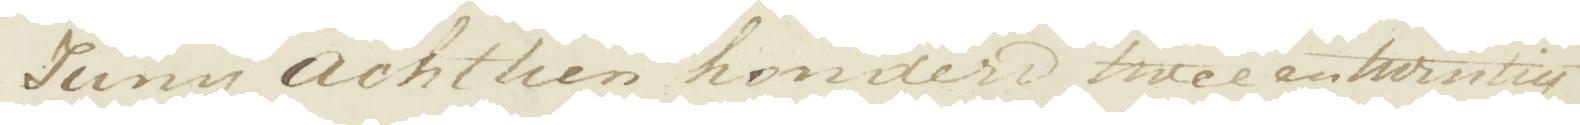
Junij achttien honderd twee en twintig
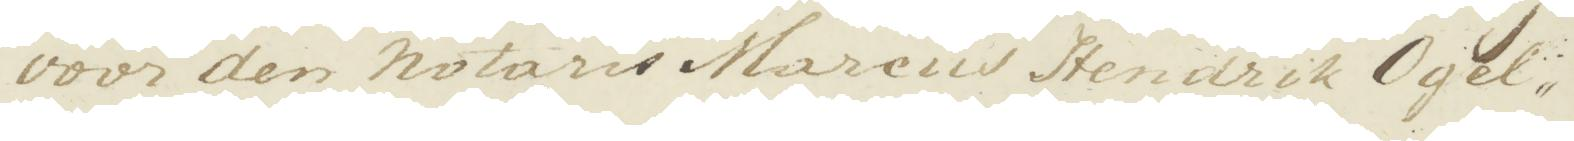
voor den notaris Marcus Hendrik Ogel„
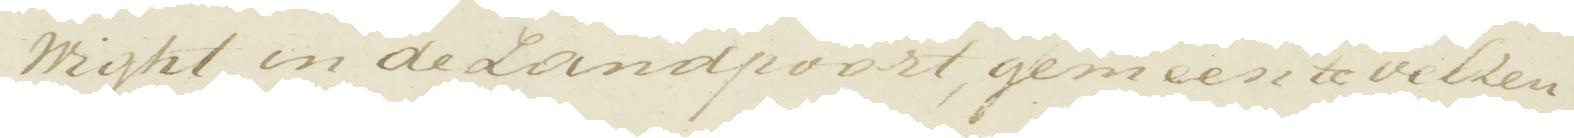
wight in de Zandpoort, gemeente velzen
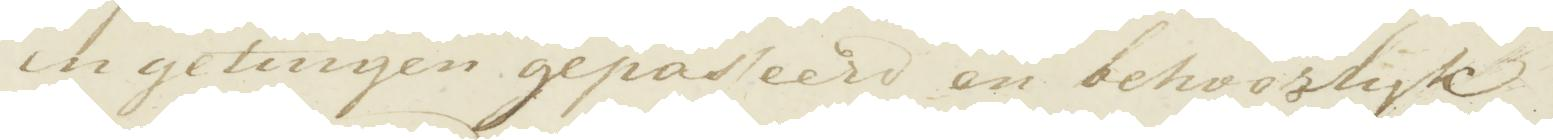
in getuigen gepasseerd en behoorlijk
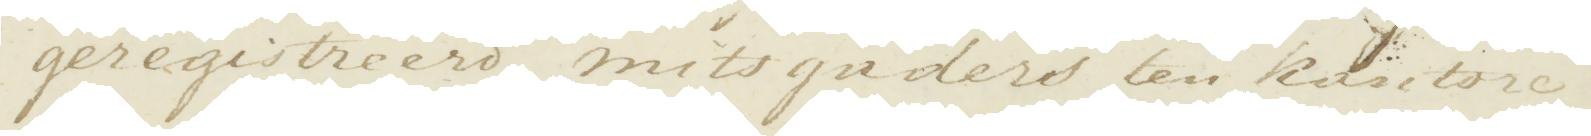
geregistreerd mitsgaders ten kantore
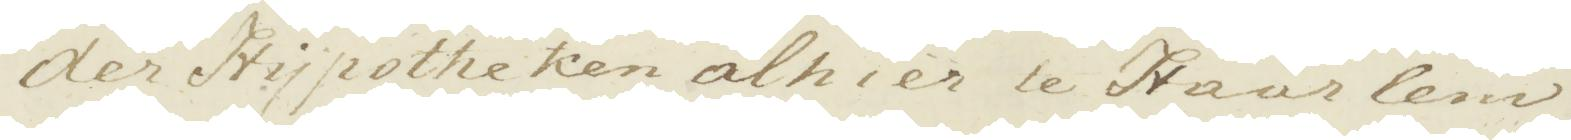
der Hijpotheken alhier te Haarlem
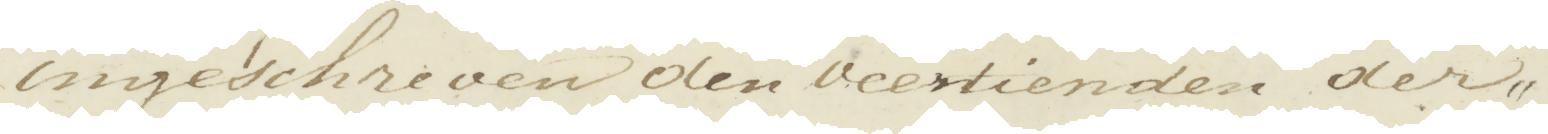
ingeschreven den veertienden der„
